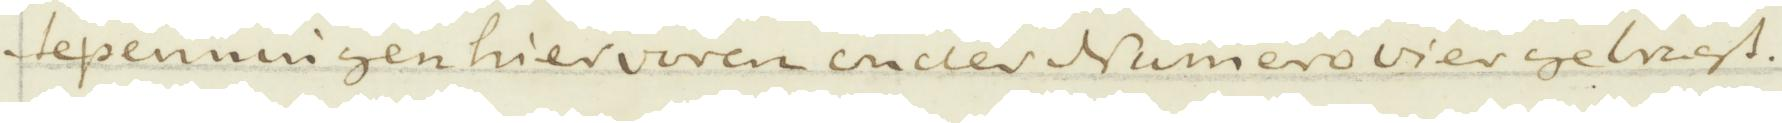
te penningen hier voren onder Numero vier gebragt.
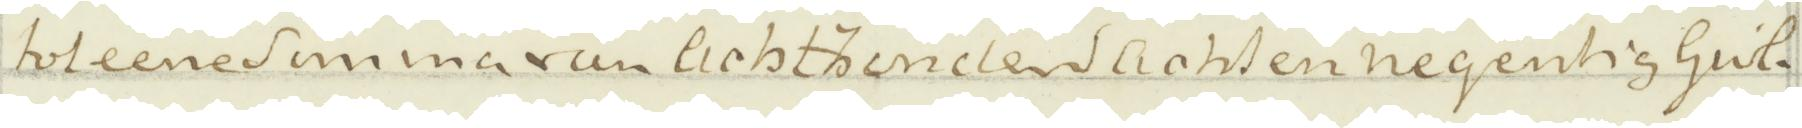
tot eene Somma van Achthonderd Achten negentig Gul=
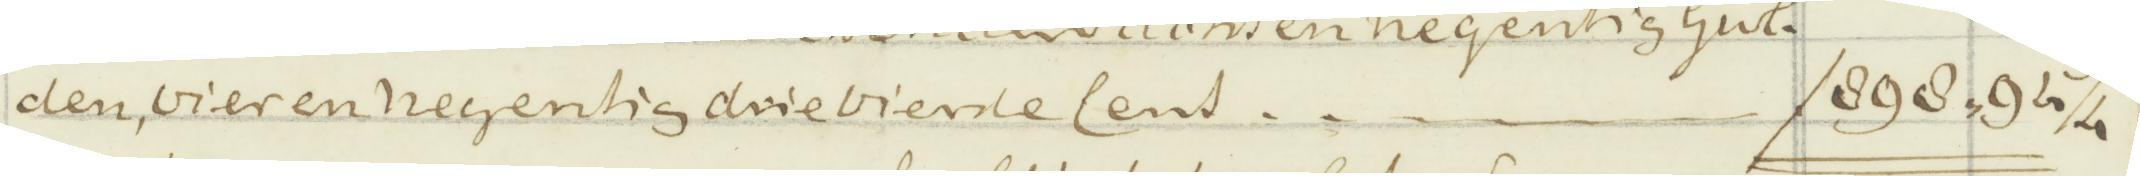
den, vier en negentig drie vierde Cent - - - - - - - - ƒ 898 „94¾
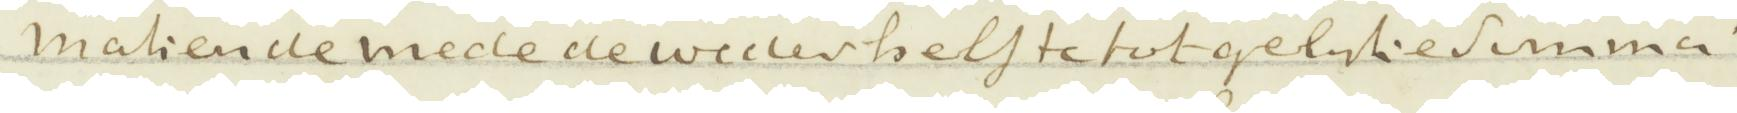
Makende mede de weder helfte tot gelyke somma
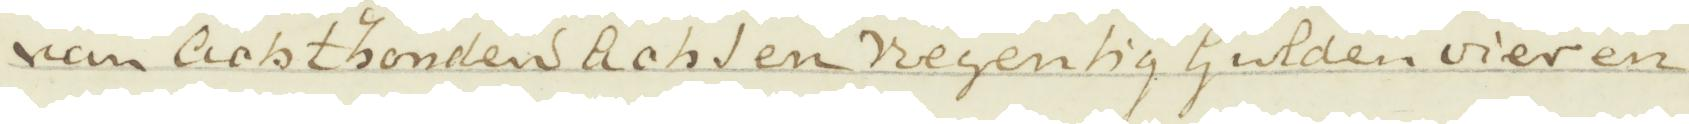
van Achthonderd achten negentig Gulden vier en
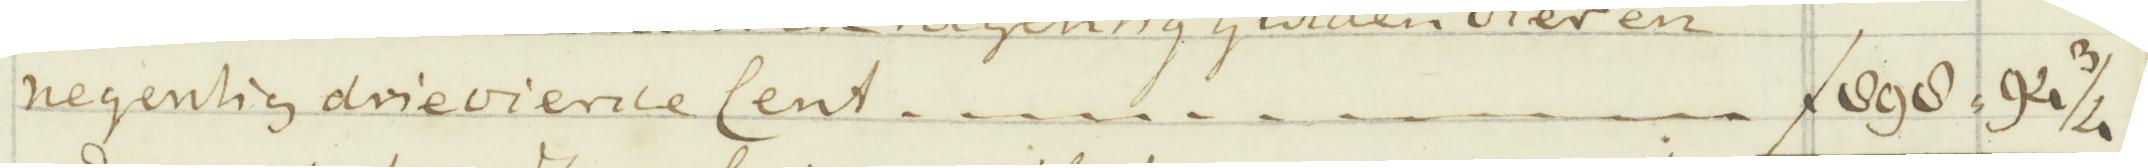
negentig drievierde Cent - - - - - - - - - - - - - - ƒ 898 „ 94¾
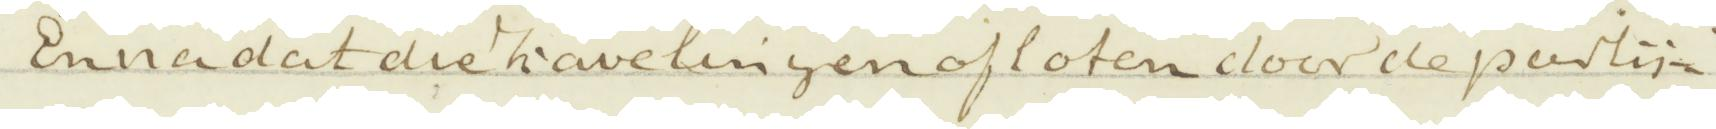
En nadat die kavelingen of loten door de partij=
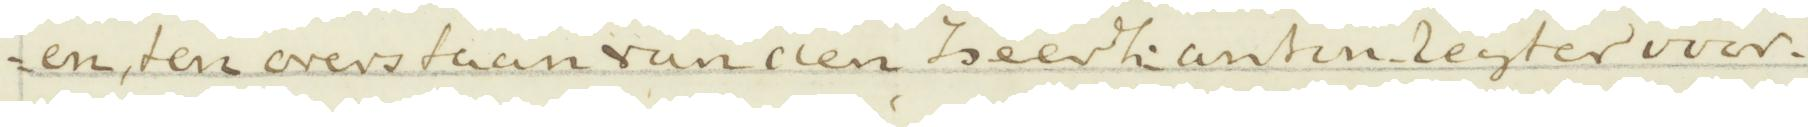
=en, ten overstaan van den heer kanton-regter voor-
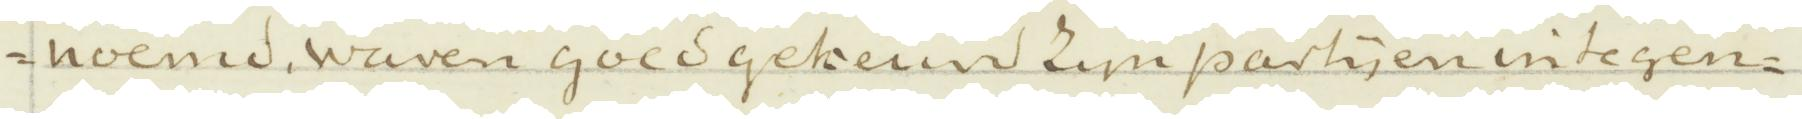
=noemd, waren goedgekeurd Zijn partijen in tegen=
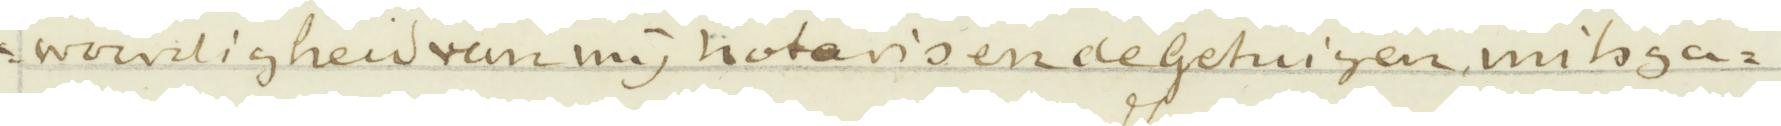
=woordigheid van mij notaris en de getuigen, mitsga=
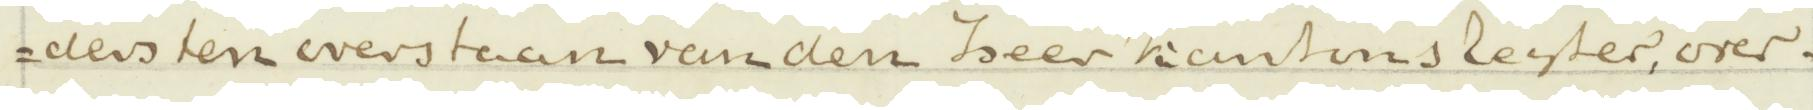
=ders ten overstaan van den Heer kantons regter, over
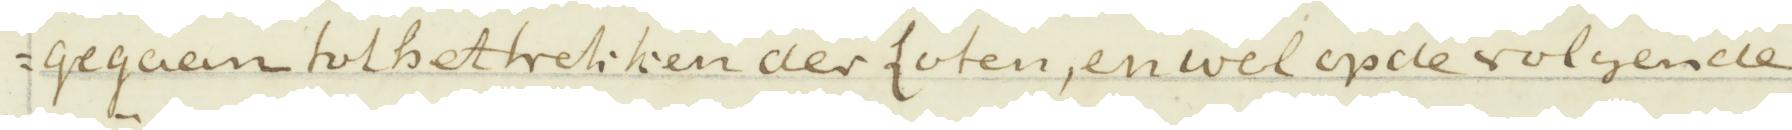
=gegaan tot het trekken der Loten, en wel op de volgende
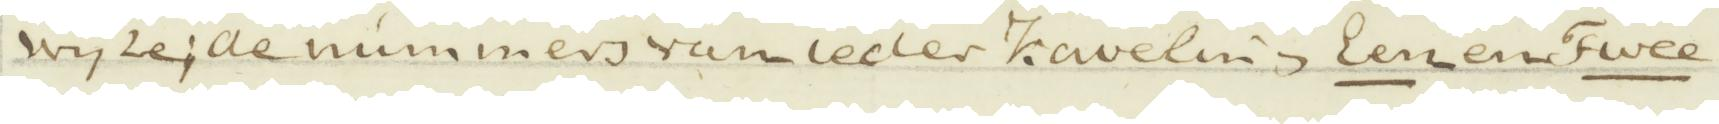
wijze: de nummers van ieder kaveling Een en Twee
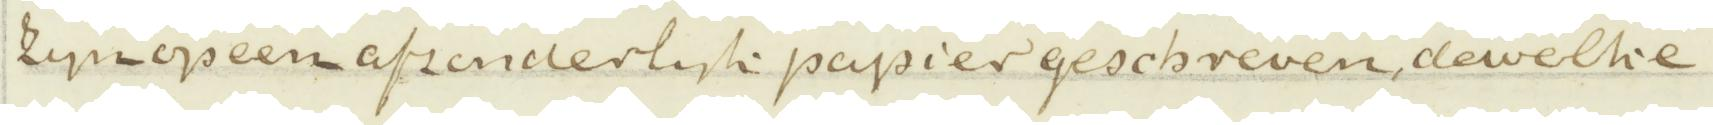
Zyn op een afzonderlyk papier geschreven, dewelke
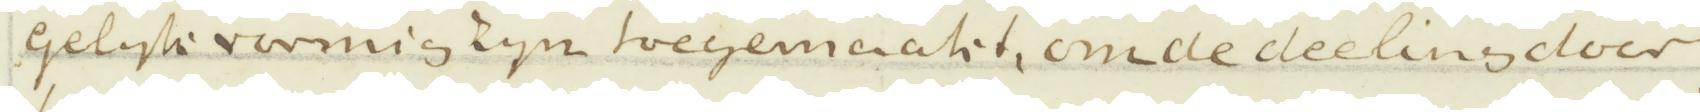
Gelykvormig Zyn toegemaakt, om de deeling door
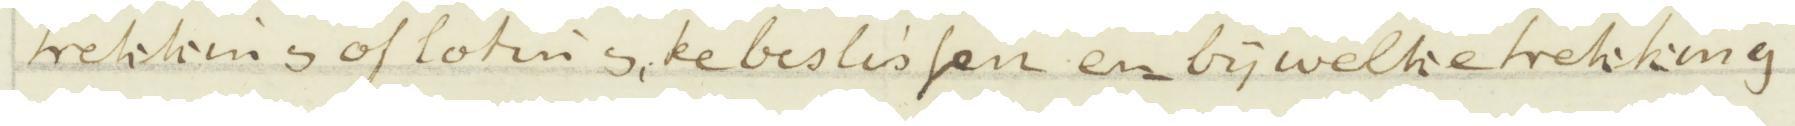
trekking of loting, te beslissen en bij welke trekking
